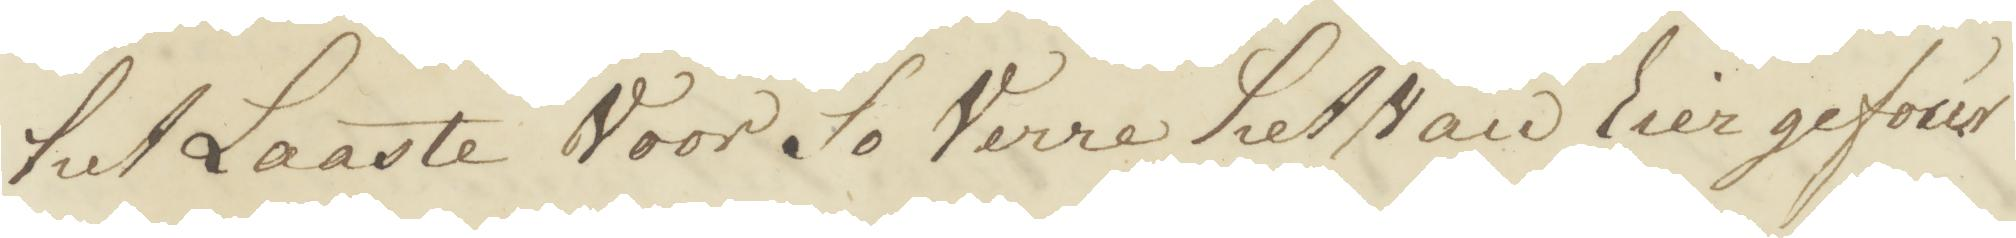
het Laaste Voor so Verre het van hier gefour
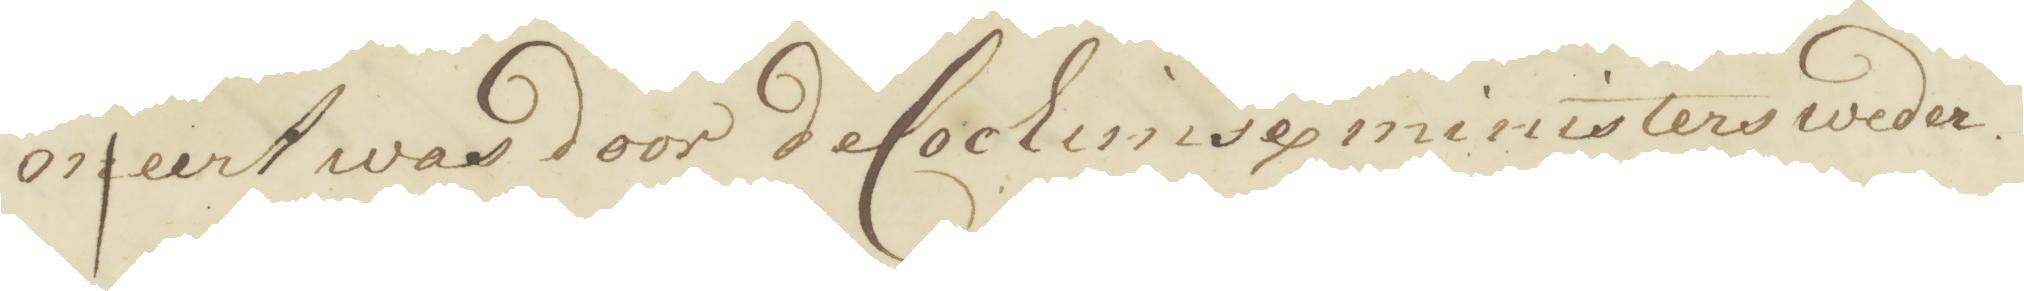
neert was door de Cochinse ministers weder
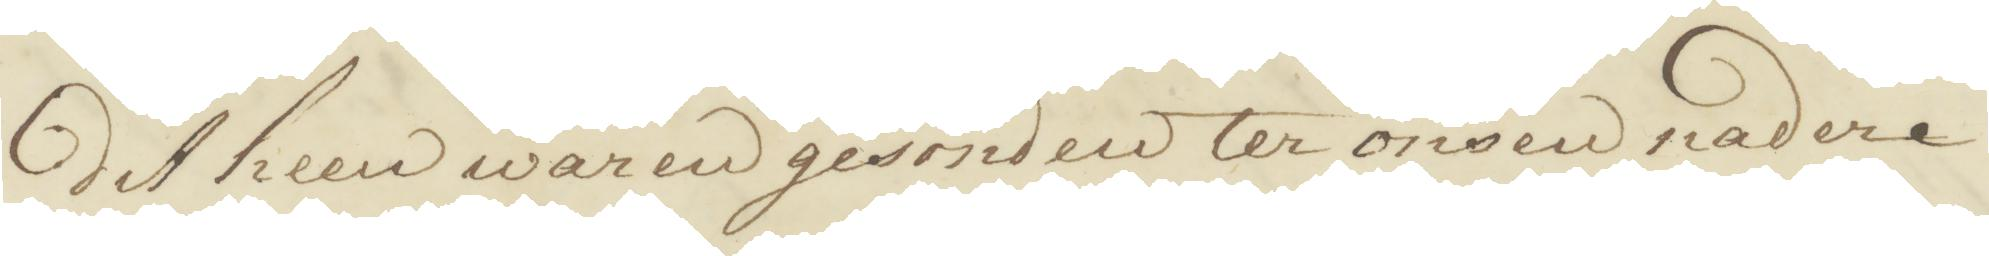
dit heen waren gesonden ter onsen nadere
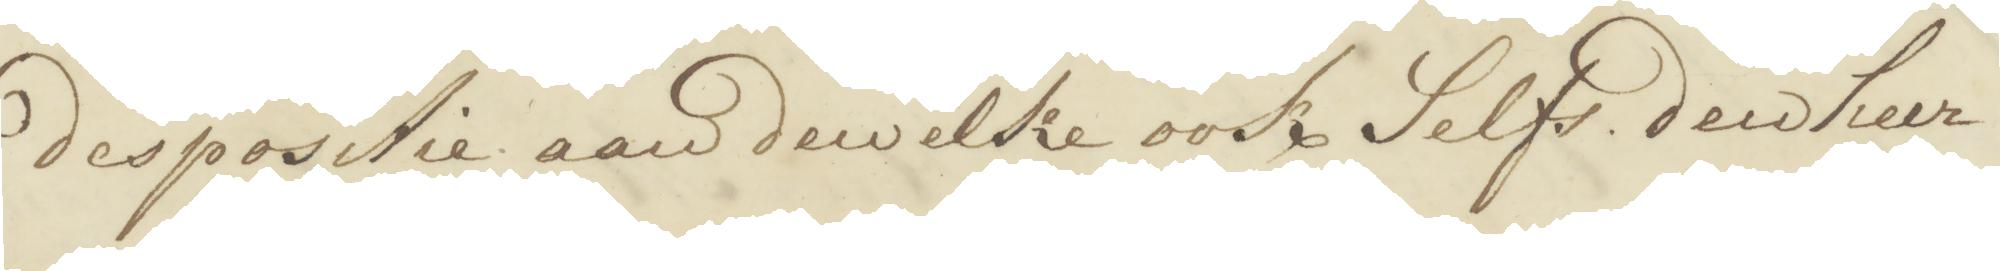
despositie aan dewelke ook selfs den heer
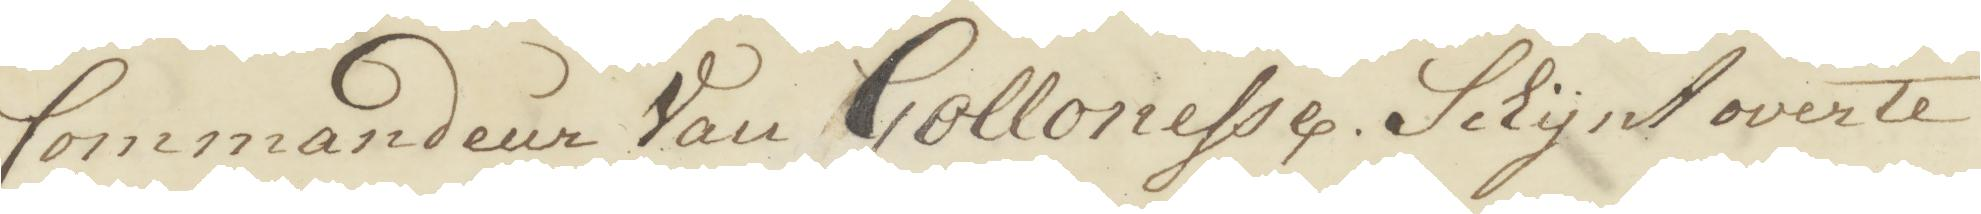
Commandeur van Gollonesse. schijnt over te
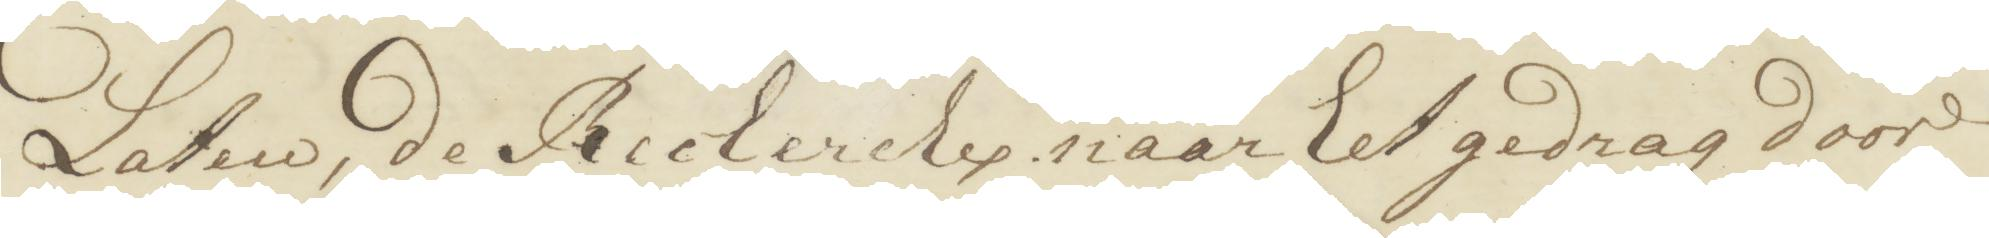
Laten, de Recherche naar het gedrag door
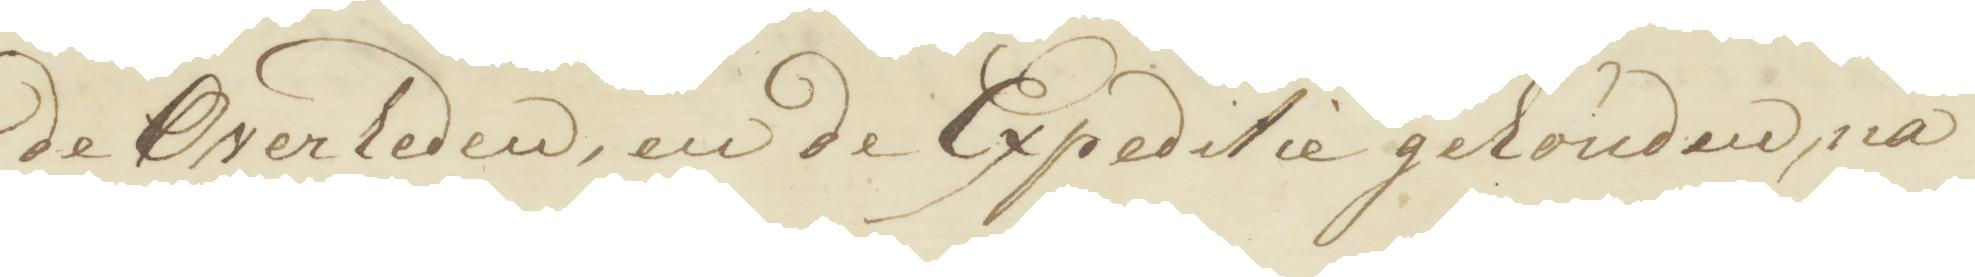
de Overheden, en de Expeditie gehouden, na
